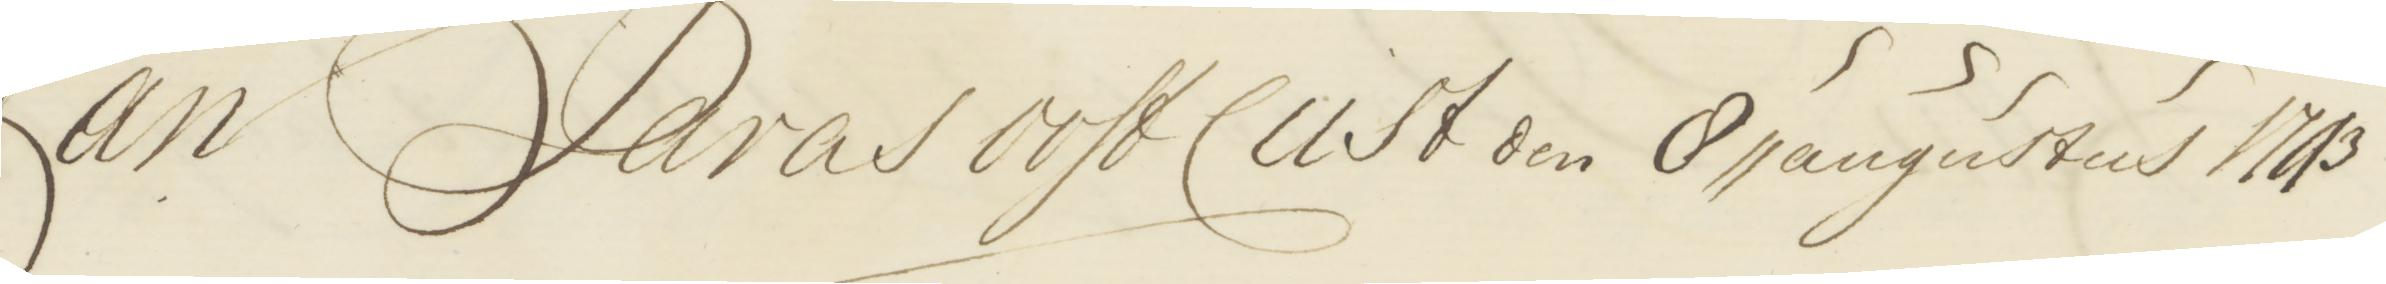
Van Javas oost Cust den 8„' augustus 1743
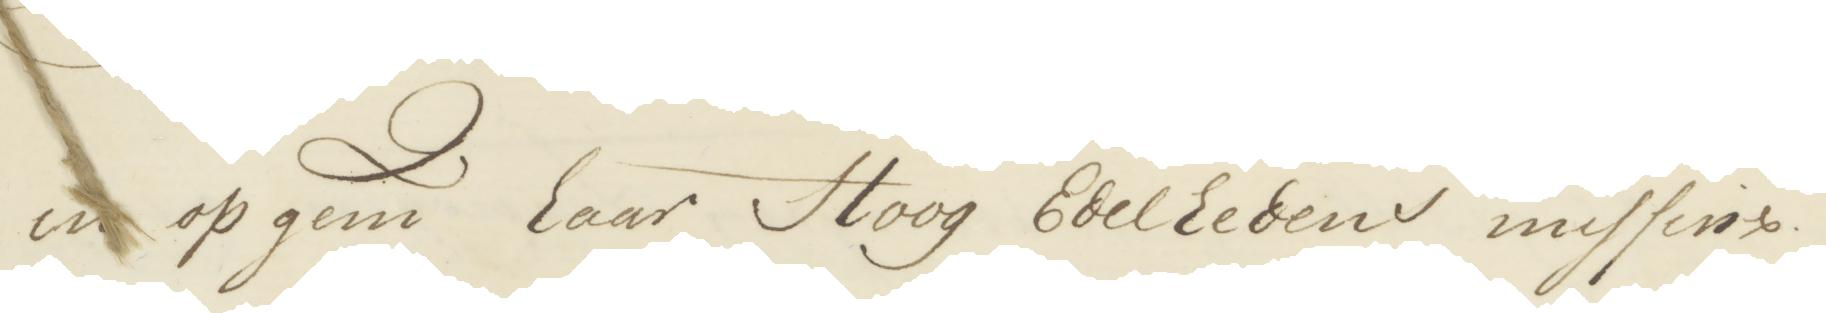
en op gem: haar Hoog Edelhedens missive
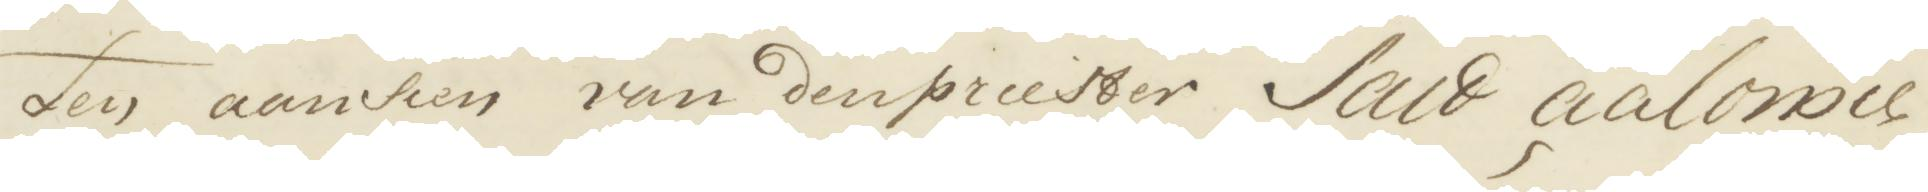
ten aansien van den priester said aalowie
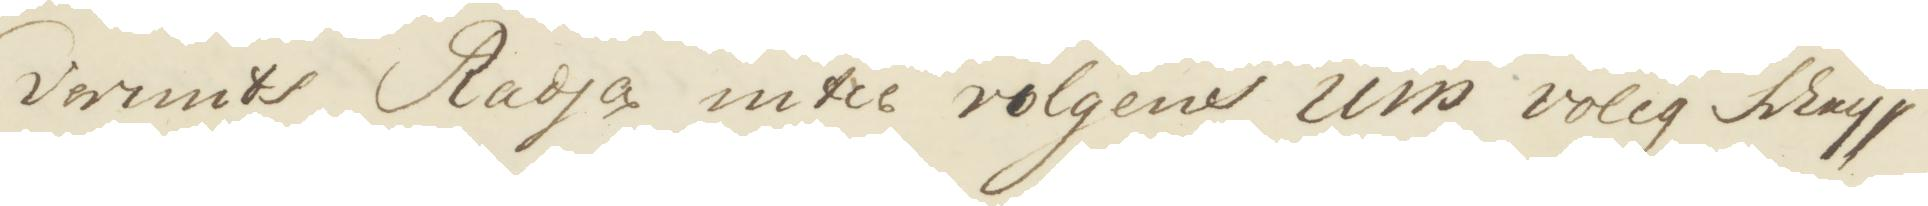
vermits Radja intie volgens uw volig schrij
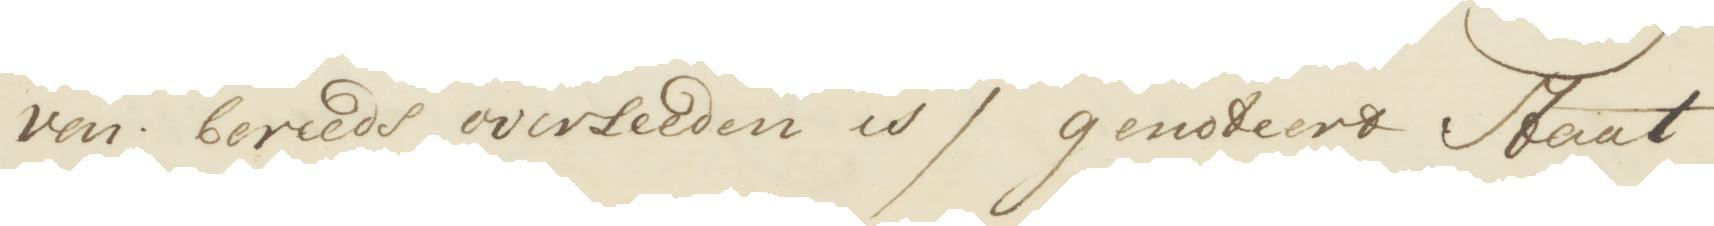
ven. bereeds overleeden is / genoteert staat
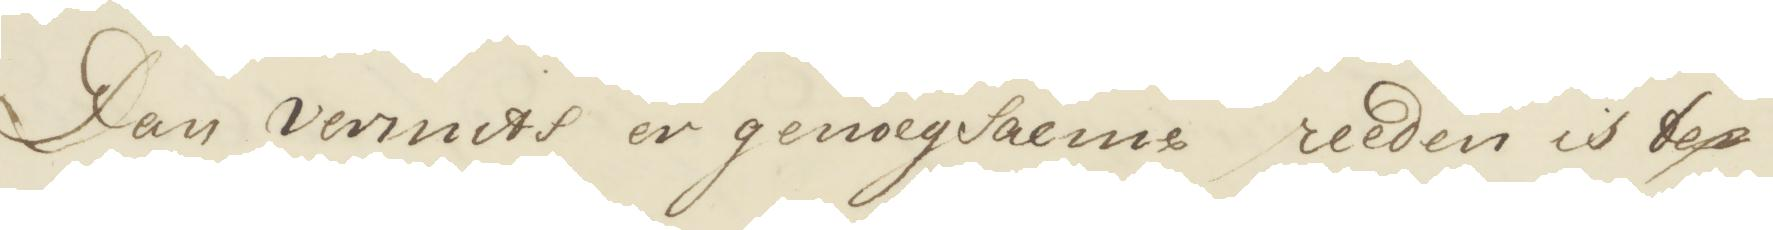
Dan vermits 'er genoegsaeme reeden is ter
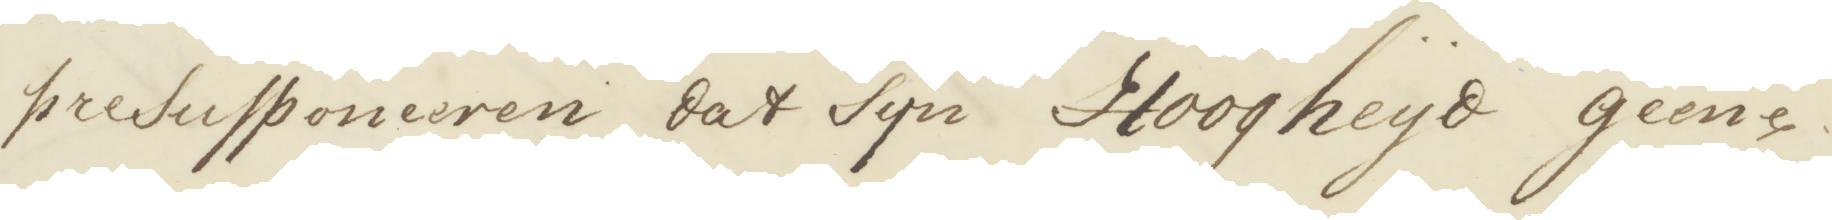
presupponeeren dat syn Hoogheijd geene
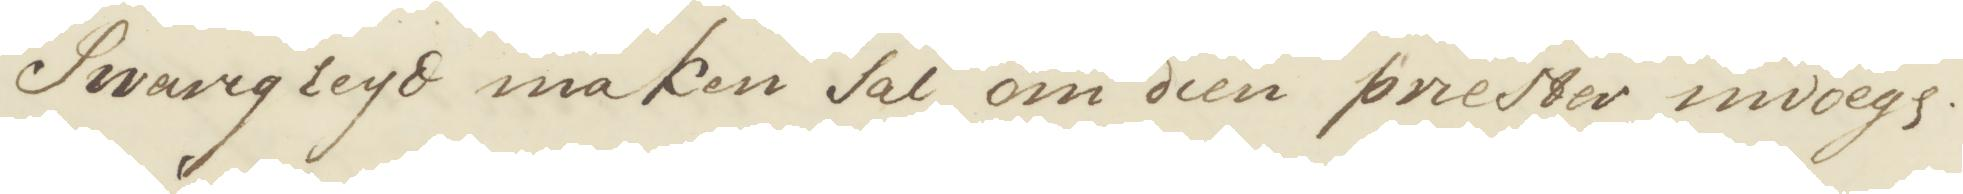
swarigheyd maken sal om dien priester invoegen
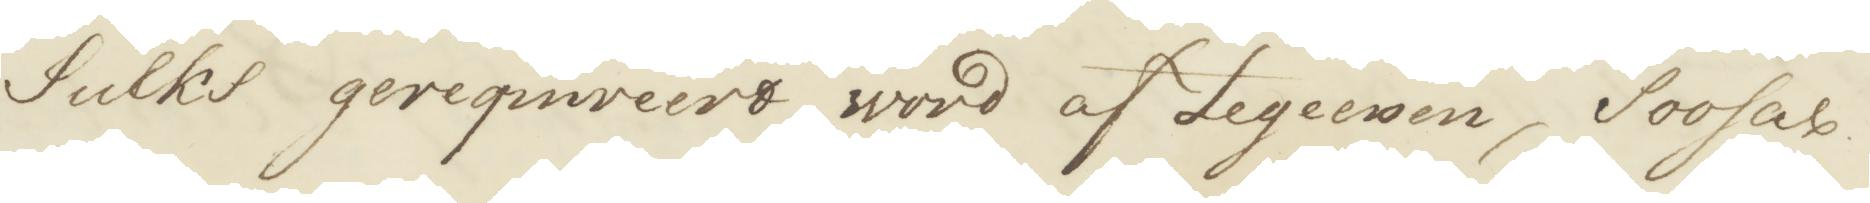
sulks gerequireert word af tegeeven, soosal
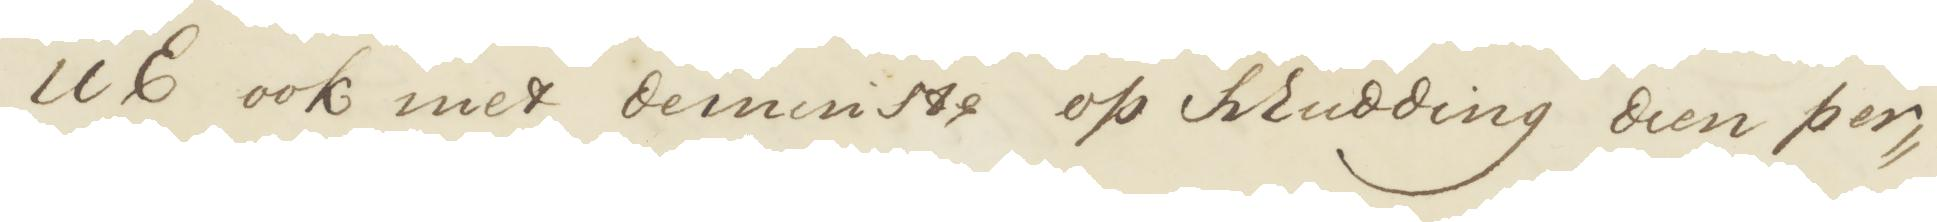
UE ook met deminste op schudding dien per„
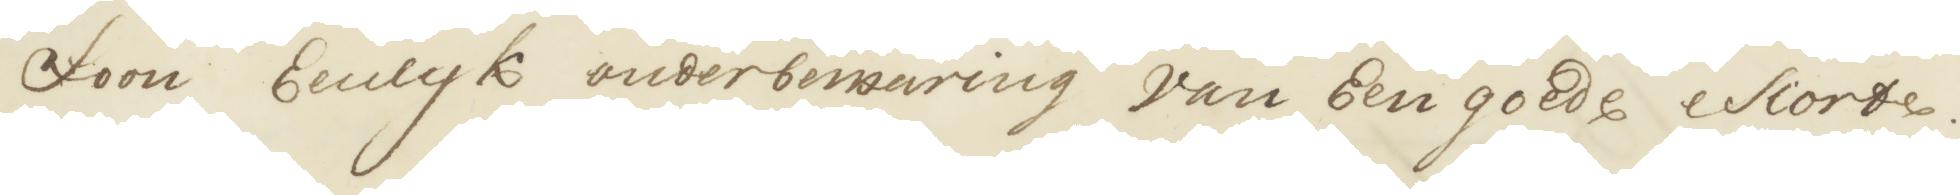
soon Eenlyk onderbewaring van Een goede escorte
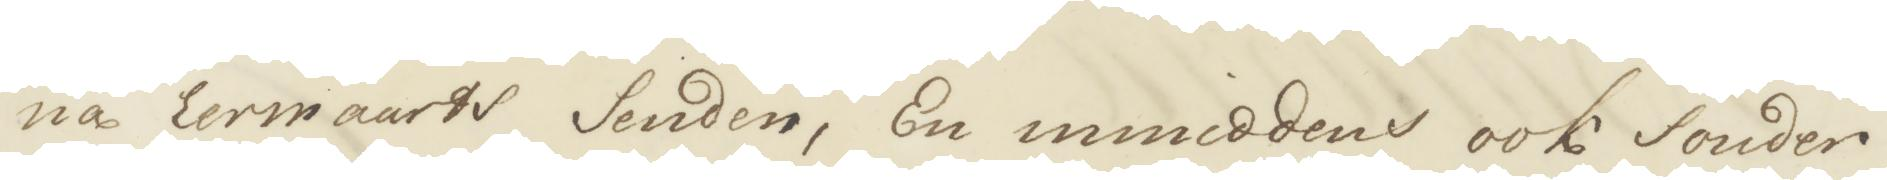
na herwaarts senden, En inmiddens ook sonder
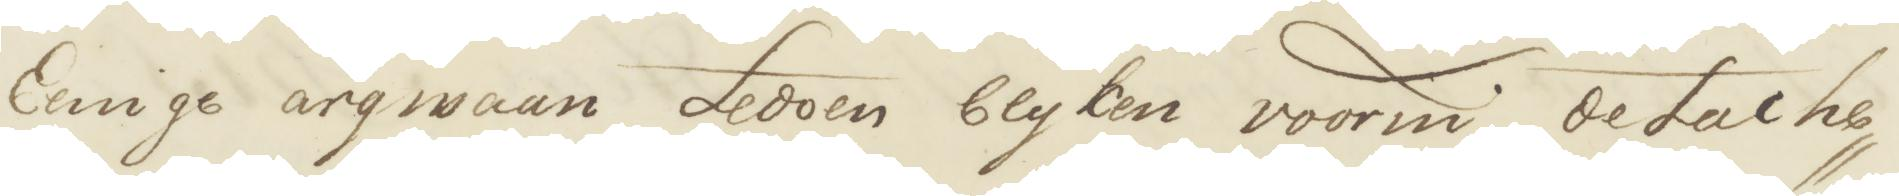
Eenige argwaan tedoen blyken voorm. detache„
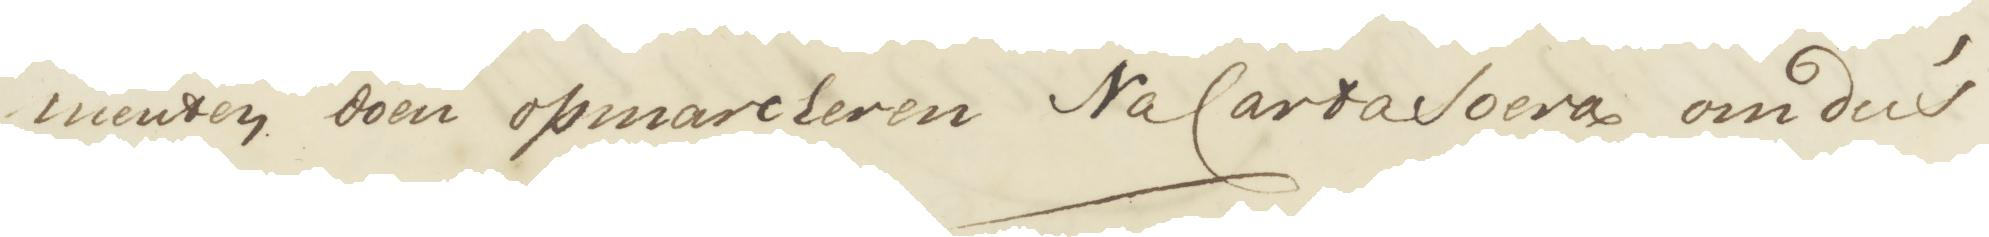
„menten doen opmarcheren Na Cartasoera om dus
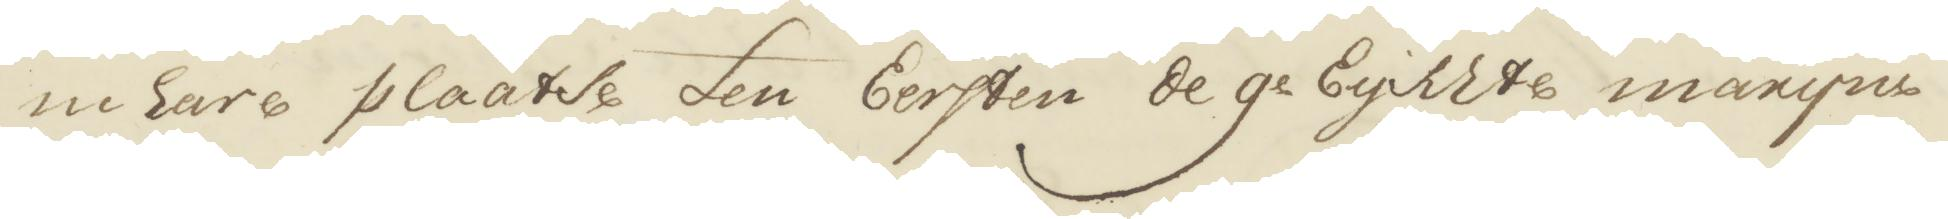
in hare plaatse ten Eersten de geEijschte marijne
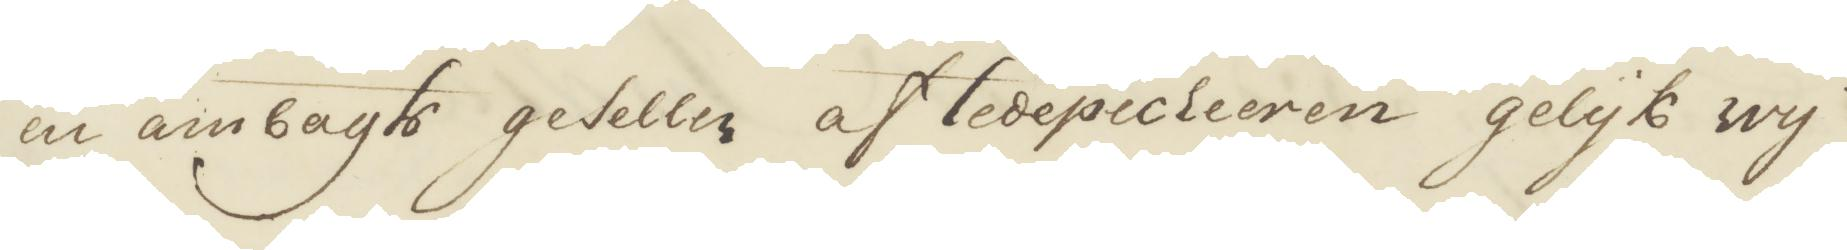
en ambagts gesellen af tedepecheeren gelijk wij
